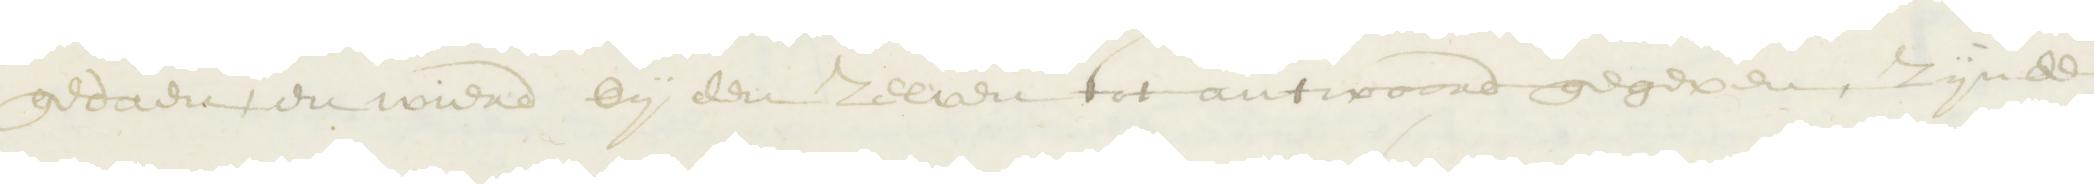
gedaen, en wierd bij den Zelven tot antwoord gegeven, Zijnde
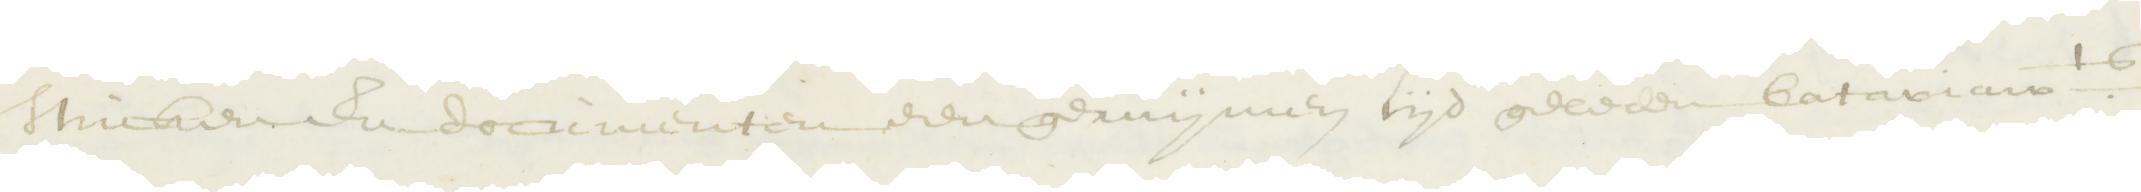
stucken En documenten een geruijmen tijd geleden bataviaw:ts
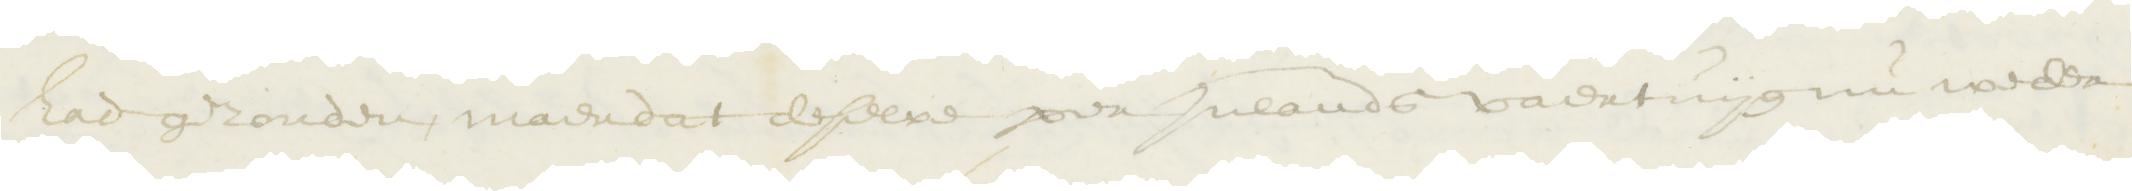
had gezonden, maer dat deselve per jnlands vaertuijg nu weder
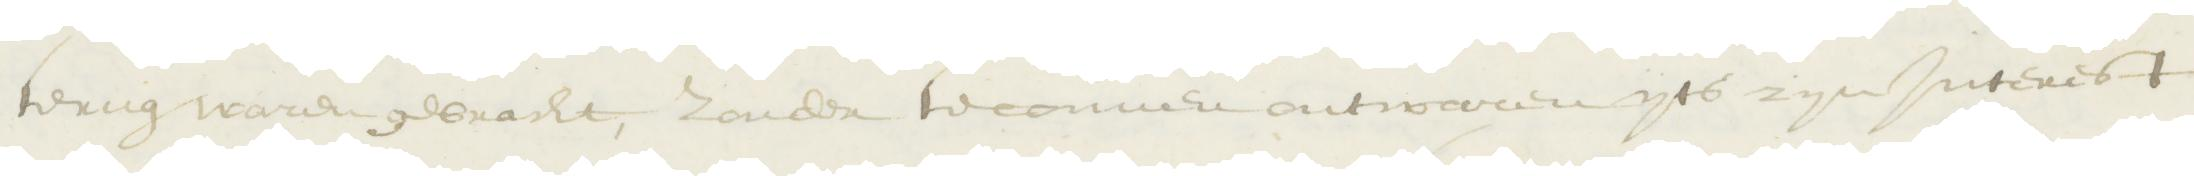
terug waren gebracht, Zonder teconnen ontwaeren ijts zijn Jnterest
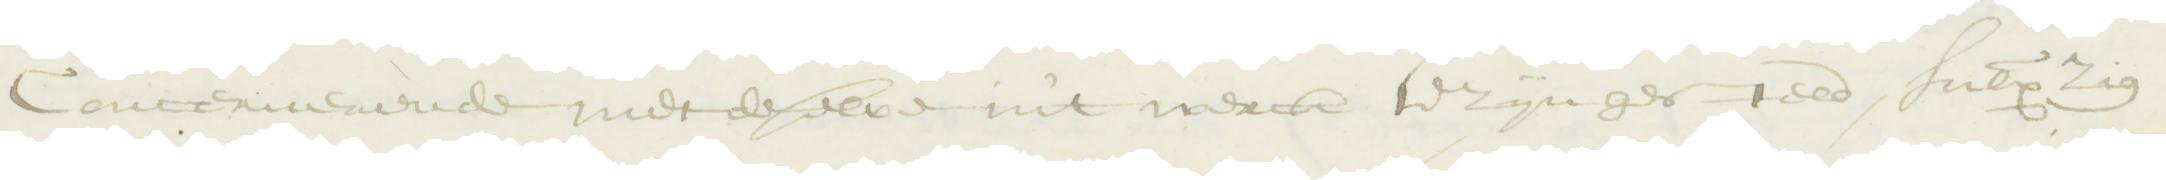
concernerende met deselve in’t werck tezijn gesteld, sulx Zig
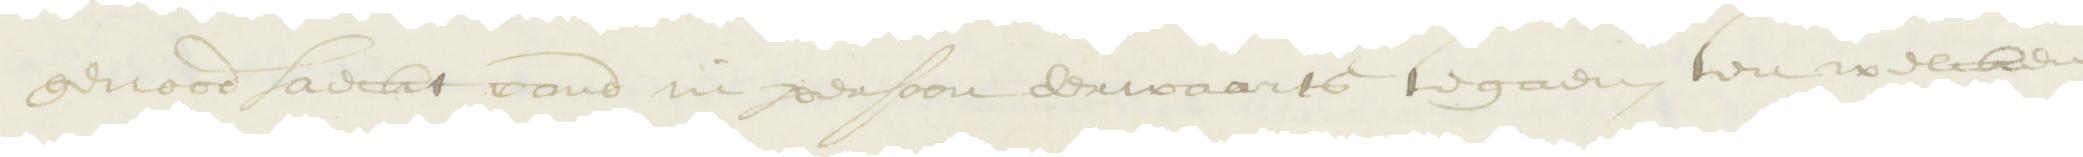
genood saeckt vond in persoon derwaarts tegaen, ten welcken
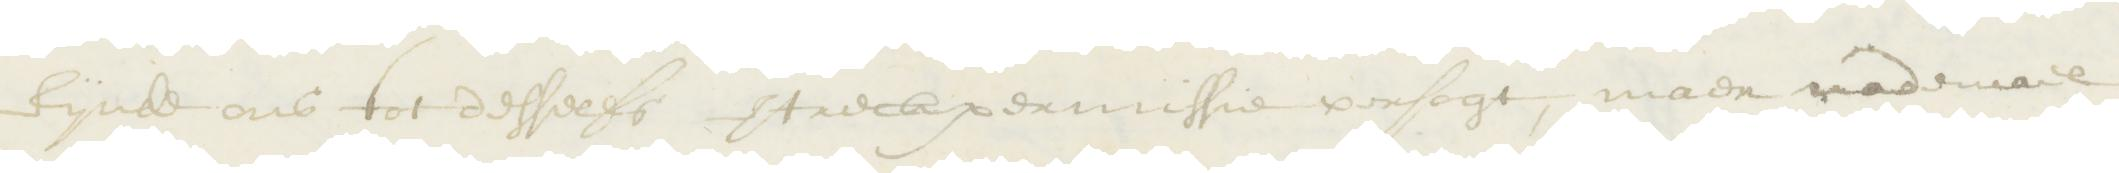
Eijnde ons tot desselfs vertreckpermissie versogt, maer nademael
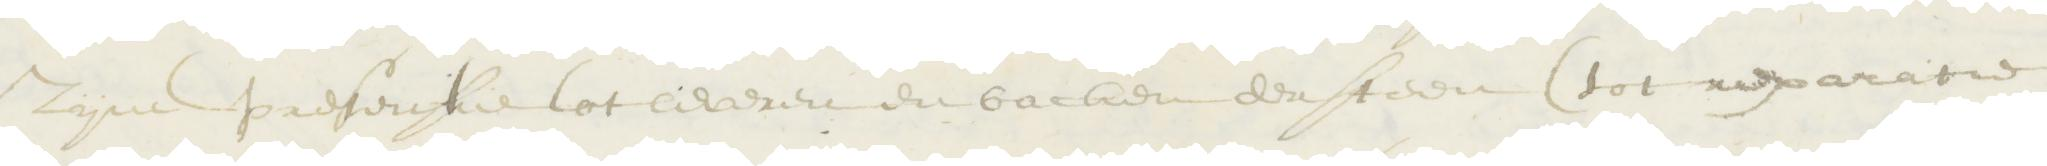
Zijne prestenstie tot leveren en backen dersteen (tot reparatie
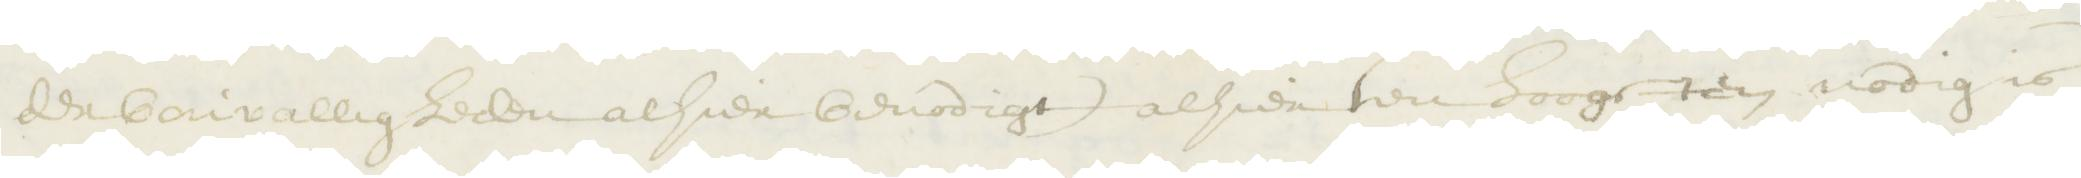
der bouvalligheden alhier benodigt) alhier ten hoogsten nodig is
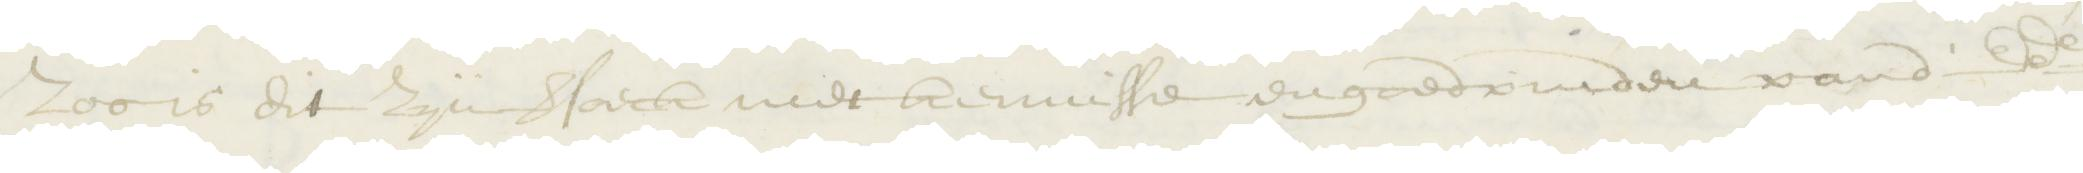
Zoo is dit Zijn versoeck met kennisse en goedvinden vand´ E=le
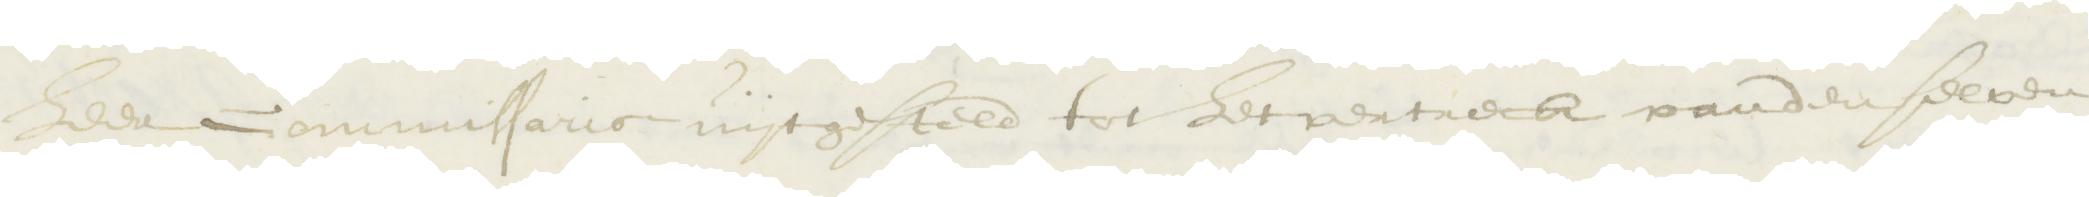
heer commissaris uijtgesteld tot het vertreck van den selven
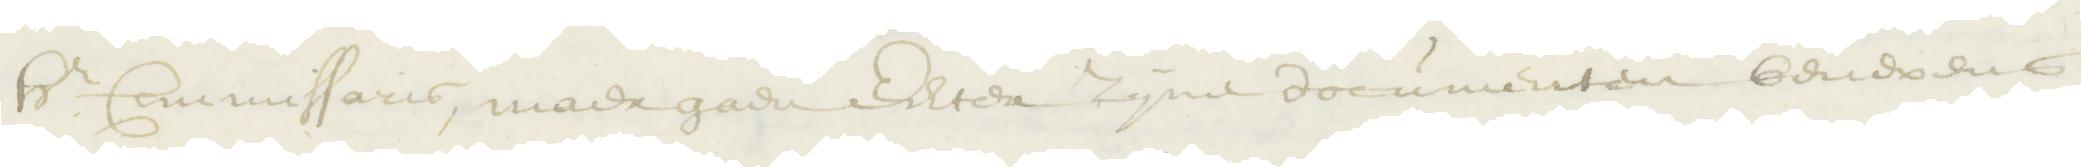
h:r Commissaris, maer gaen Echter Zijne documenten benevens
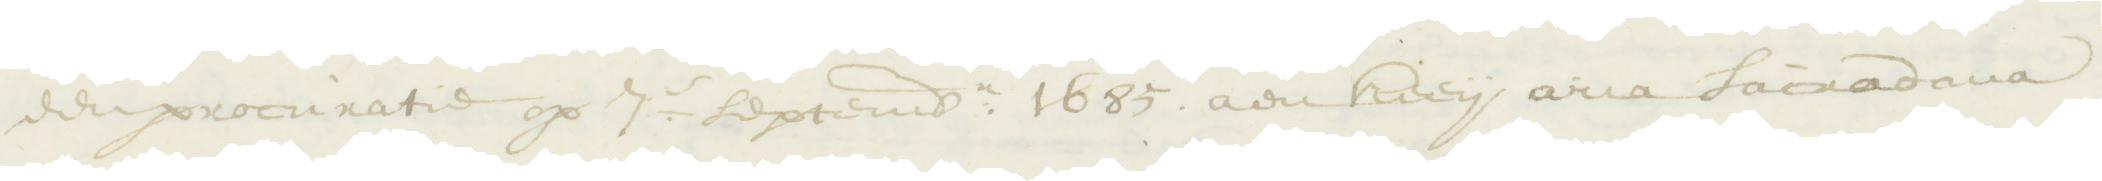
een procuratie op 7:´septemb:r 1685. aen keeij aria Sacradana
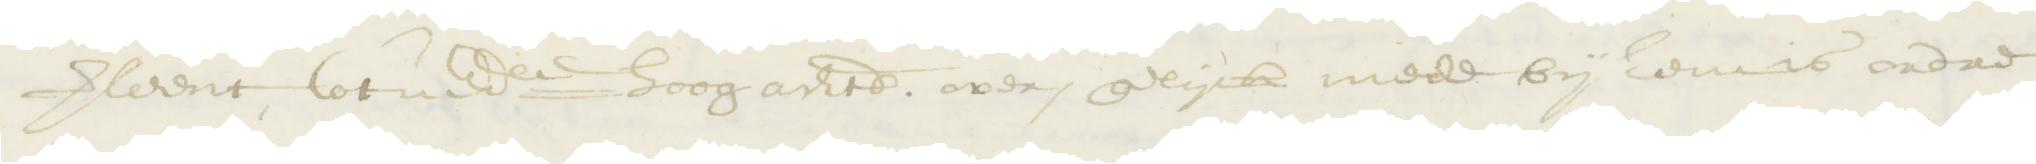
verleent, tot uEd=le hoog achtb. ordre, gelijck mede bij hem is ordre
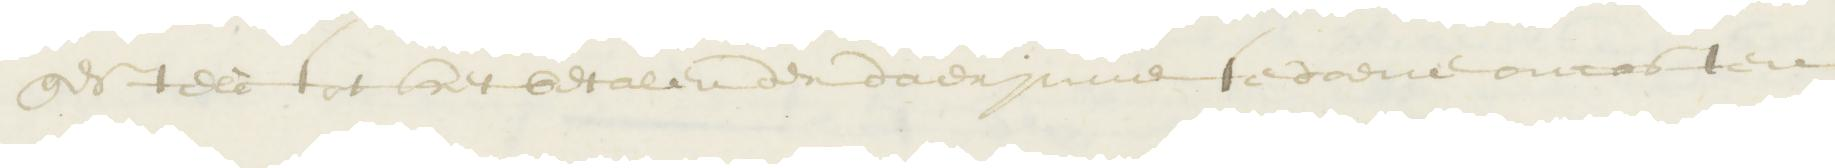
gesteld tot het betalen den daerjnne te doene oncosten
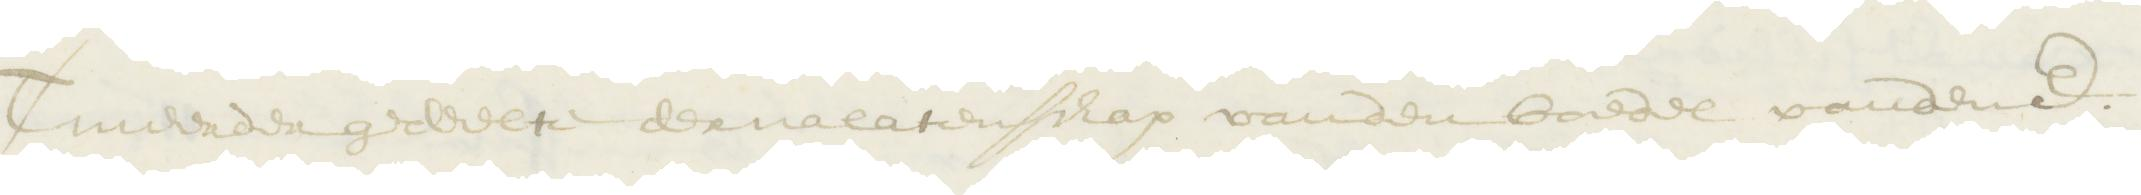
´T meerder gedeelte dernalatenschap van den boedel vanden E:
